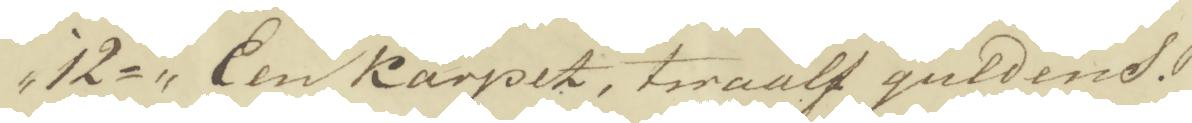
„12= „ Een karpet, twaalf guldens.
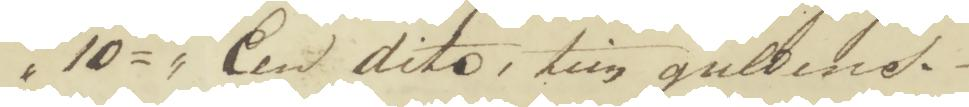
„ 10= „ Een dito, tien guldens.
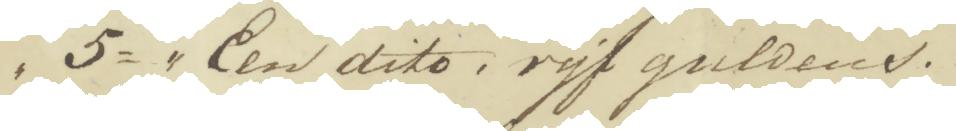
„ 5= „ Een dito, vijf guldens.
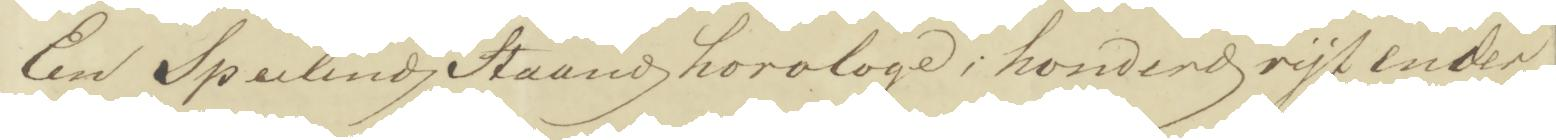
Een Speelend, Staand horologe; honderd vijf en der,
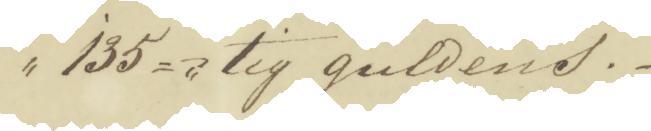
„ 135=„tig guldens.
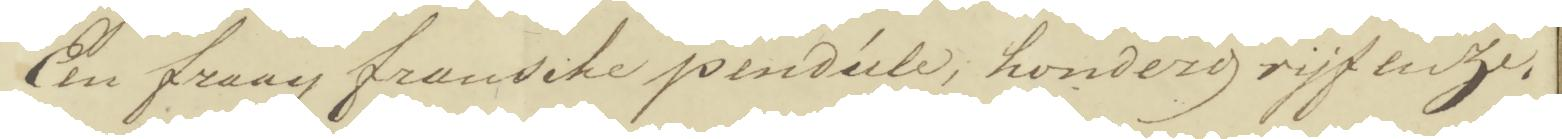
Een fraay fransike pendule, honderd vijf en ze,
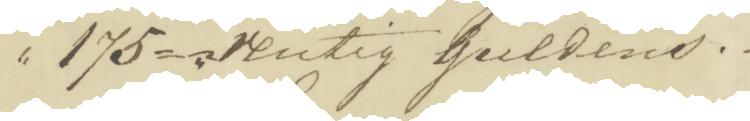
„ 175= „ventig guldens.
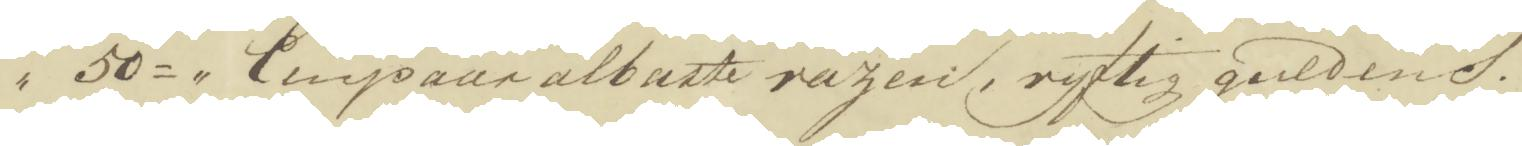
„ 50= „ Een paar albaste vazen, vyftig guldens.
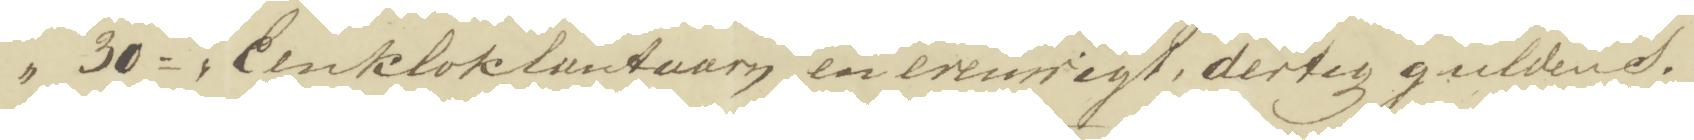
„ 30= „ Een kloklantaarn en evenwigt, dertig guldens.
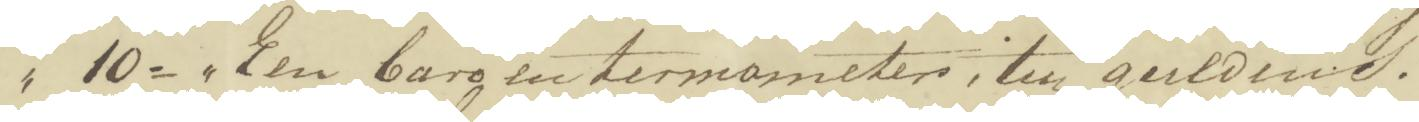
„ 10= „ Een barg en termometer, tien guldens.
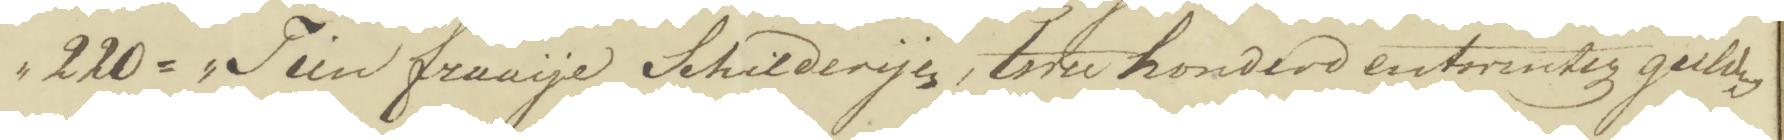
„ 220= „ Tien fraaije schilderijen, twee honderd en twintig geelden
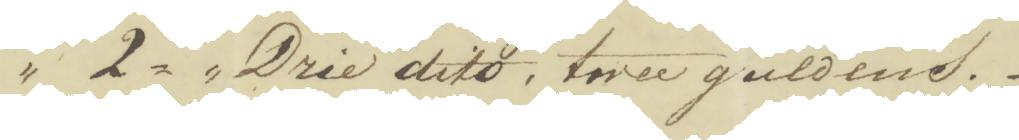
„ 2= „ Drie dito, twee guldens.
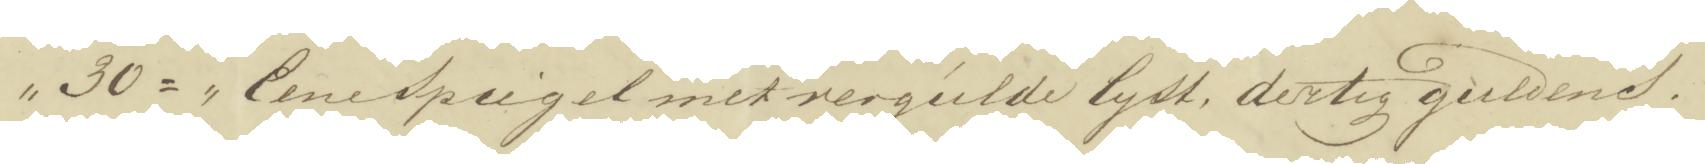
„ 30= „ Eene spiegel met vergulde lyst, dertig guldens.
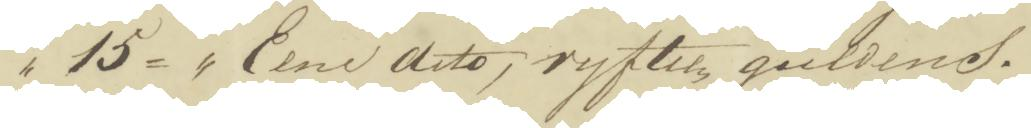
„ 15= „ Eene dito, vyftien guldens.
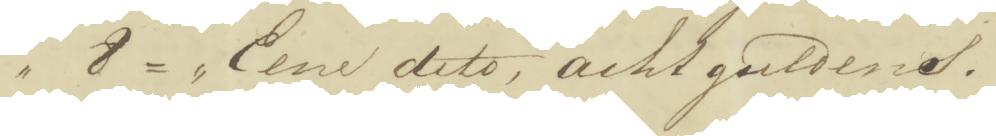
„ 8= „ Eene dito, acht guldens.
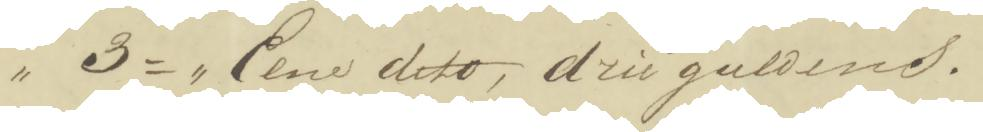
„ 3= „ Eene dito, drie guldens.
